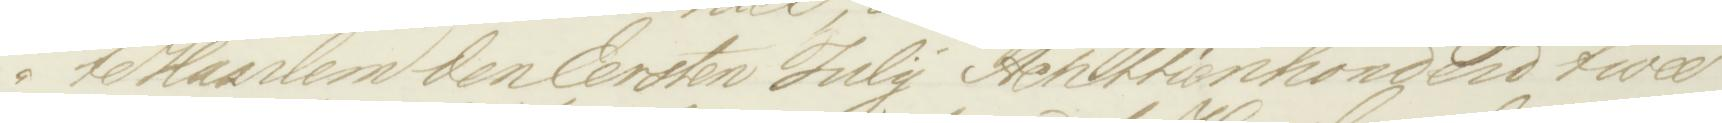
„ te Haarlem den Eersten Iulij Achttienhonderd twee
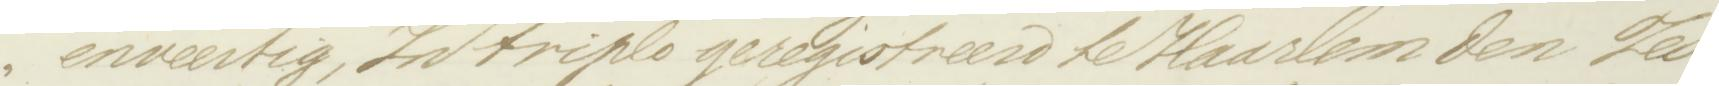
„ enveertig, In triplo geregistreerd te Haarlem den Zes.
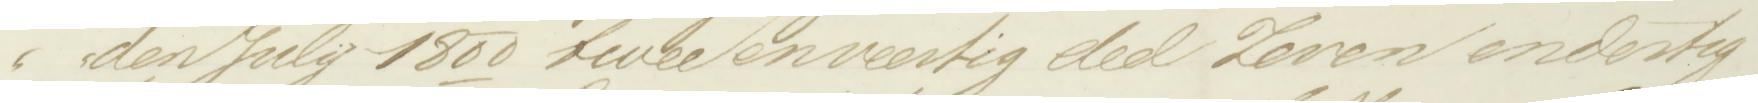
„ „den Julij 1800 twee enveertig deel Zeven endertig
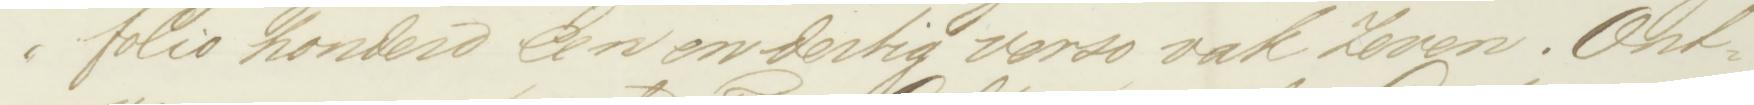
folio honderd Een en dertig verso vak zeven. Ont„
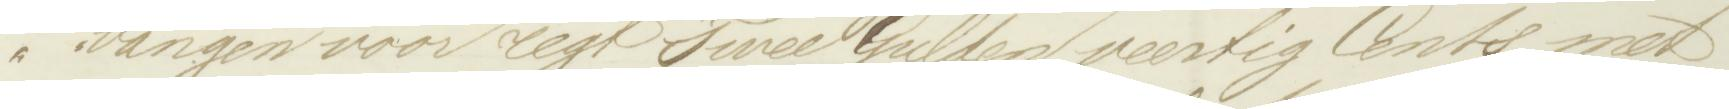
„ vangen voor regt Twee Gulden veertig Cents met
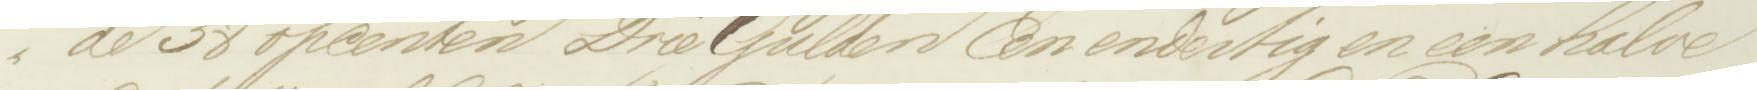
„ de 38 opcenten Drie Gulden Een endertig en een halve
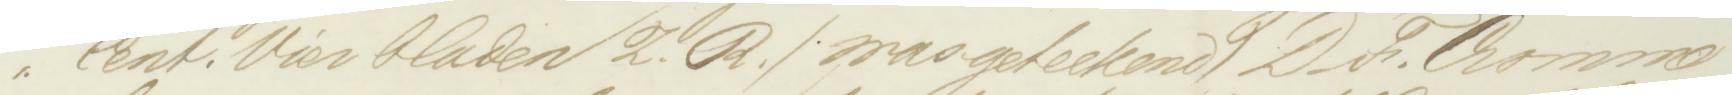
„ Cent. Vier bladen Z. R. /:was geteekend/ D F. Cromme
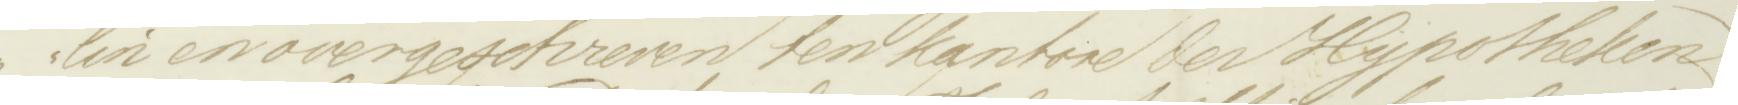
„ „lin en overgeschreven ten kantore der Hijpotheken
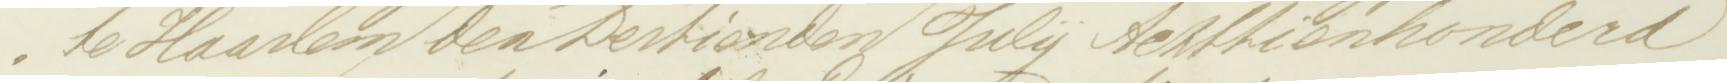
te Haarlem den Dertienden Julij Achttienhonderd
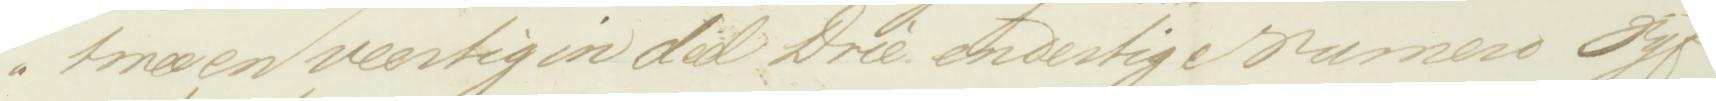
„ twee en veertig in deel Drie endertig Numero Vijf
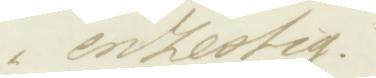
en Zestig.
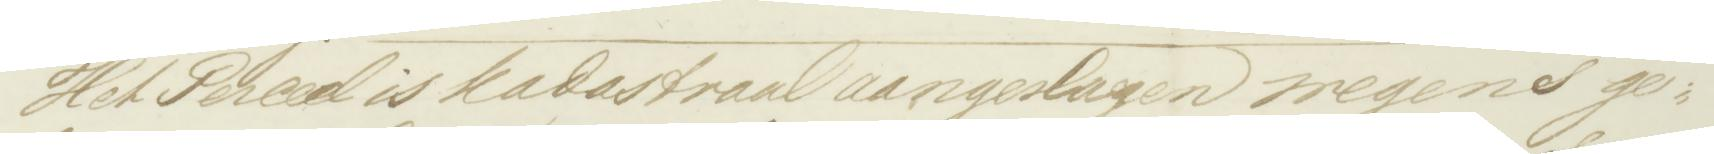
Het Perceel is kadastraal aangeslagen wegens ge„
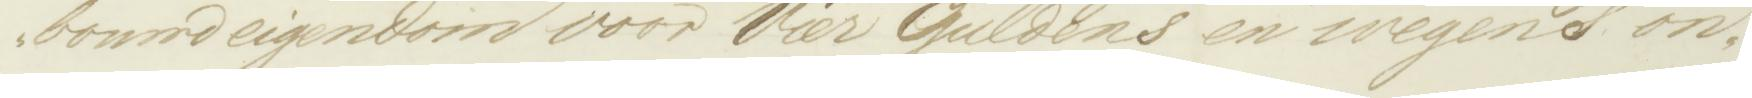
„ bouwd eigendom voor Vier Guldens en wegens on„
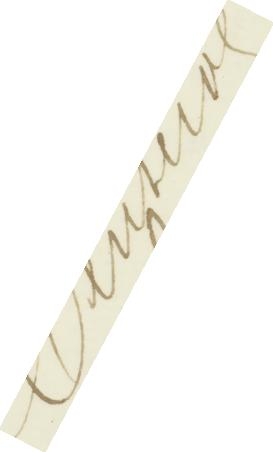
Centure
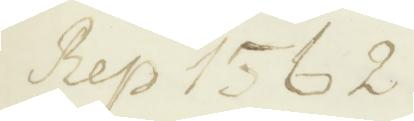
Rep 1562
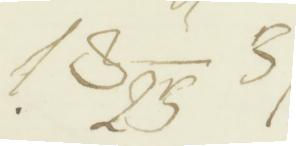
18 4/25 37
